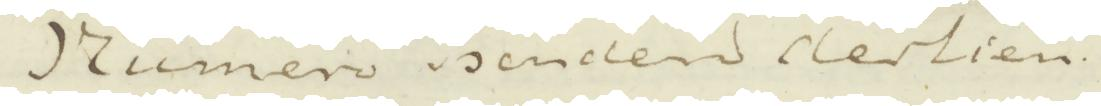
Numero honderd dertien.
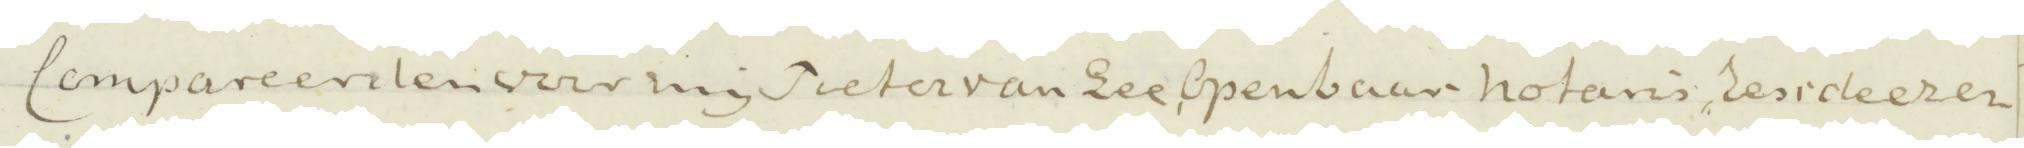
Compareerden voor mij Pieter van Lee Openbaar notaris, resideeren
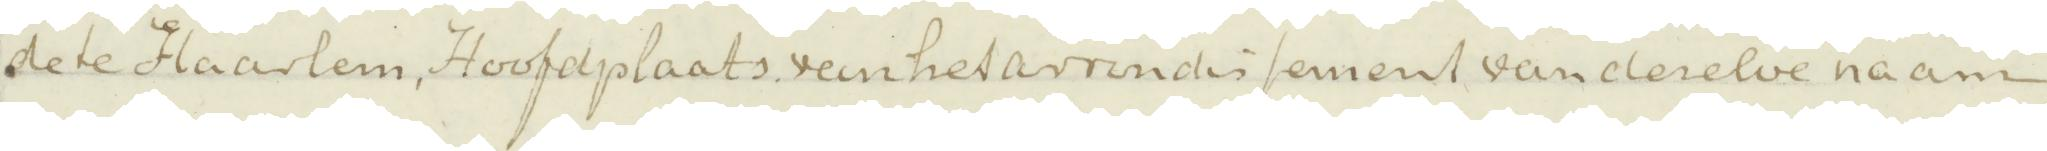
de te Haarlem, Hoofdplaats van het arrondissement van dezelve naam
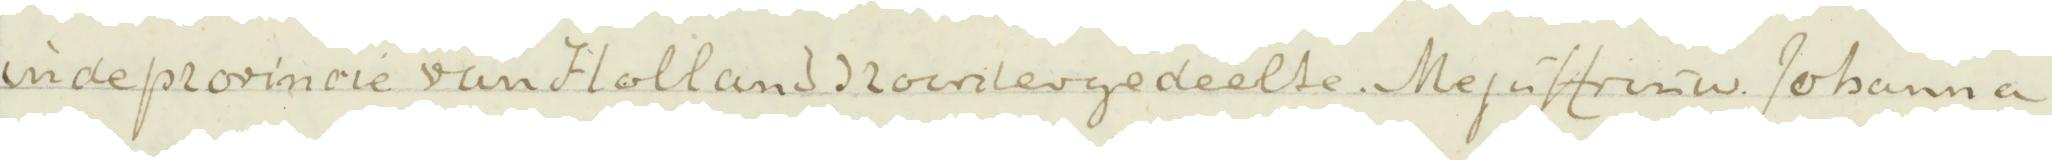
n de provincie van Holland Noordergedeelte Mejuffrouw. Johanna
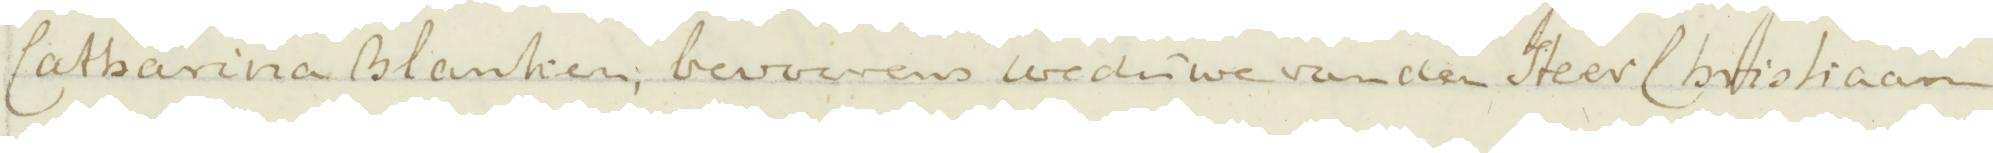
Catharina Blanken; bevoorens weduwe van den Heer Christiaan
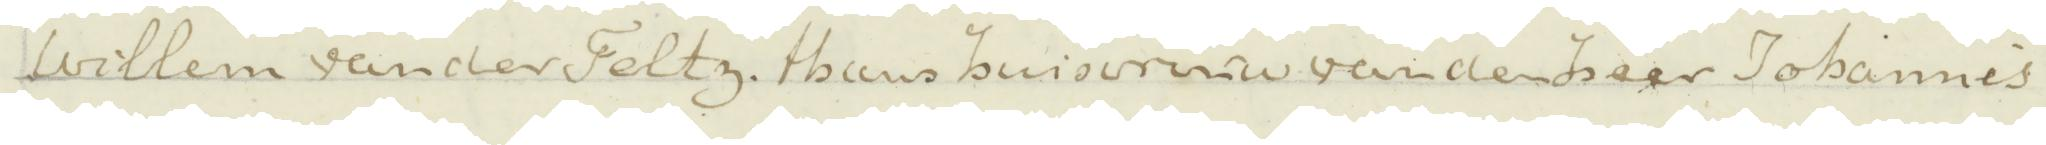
Willem van der Feltz. thans huisvrouw van den heer Iohannes
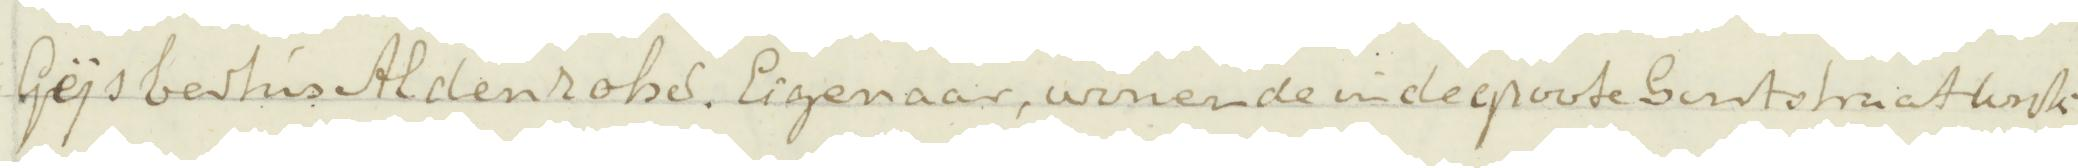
Gijsbertus Aldenrohd, Eigenaar, wonende in de groote bontstraat wijk
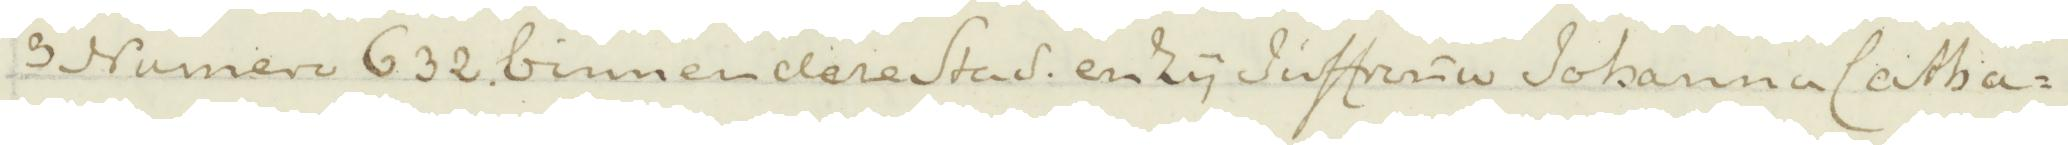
3 Numero 632. binnen deze Stad. en zij Juffrouw Johanna Catha=
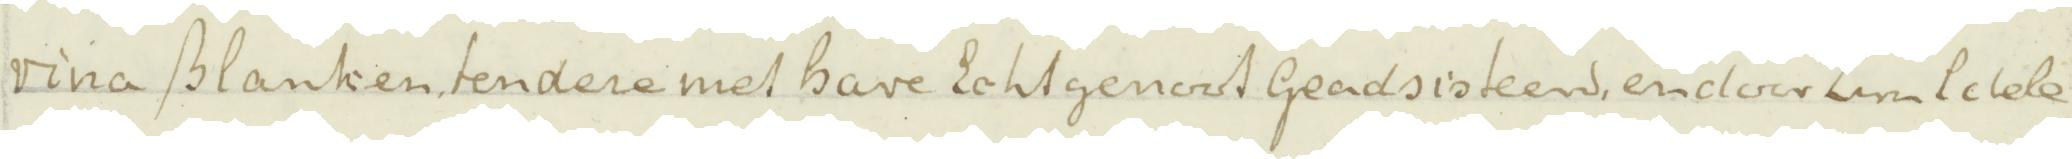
rina Blanken ten deze met hare Echtgenoot geadsisteerd, en door hem Edele
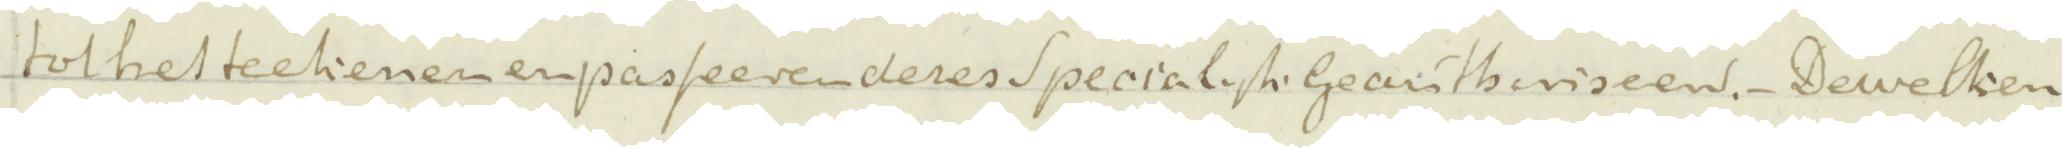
tot het teekenen en passeeren dezes specialyk geauthoriseerd,- Dewelken
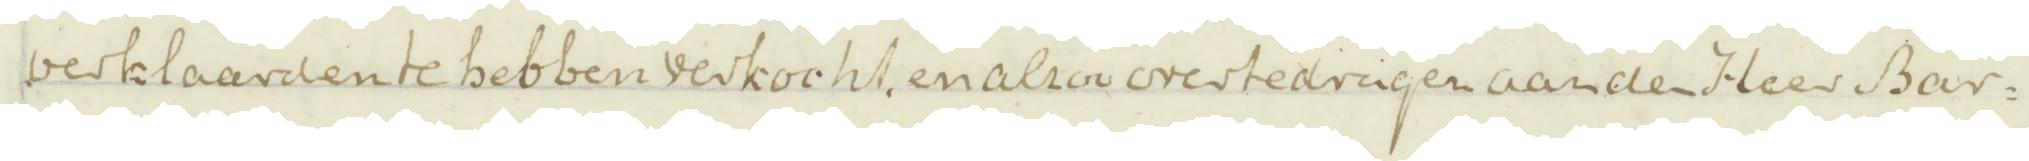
verklaarden te hebben verkocht, en alzoo over te dragen aan den Heer Bar=
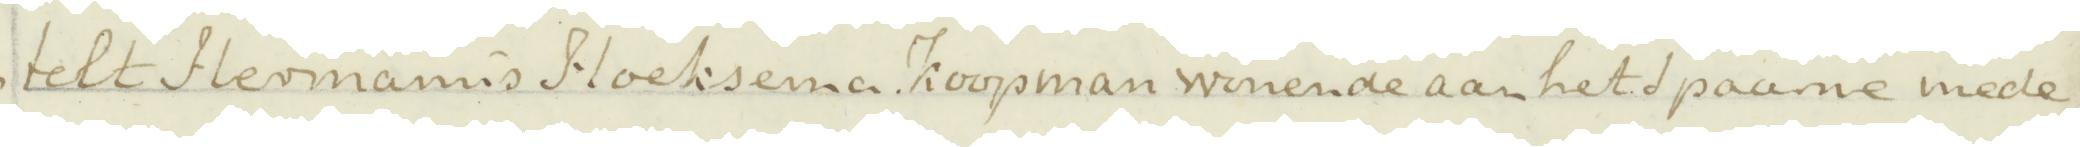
telt Hermanus Hoeksema. Koopman wonende aan het spaarne mede
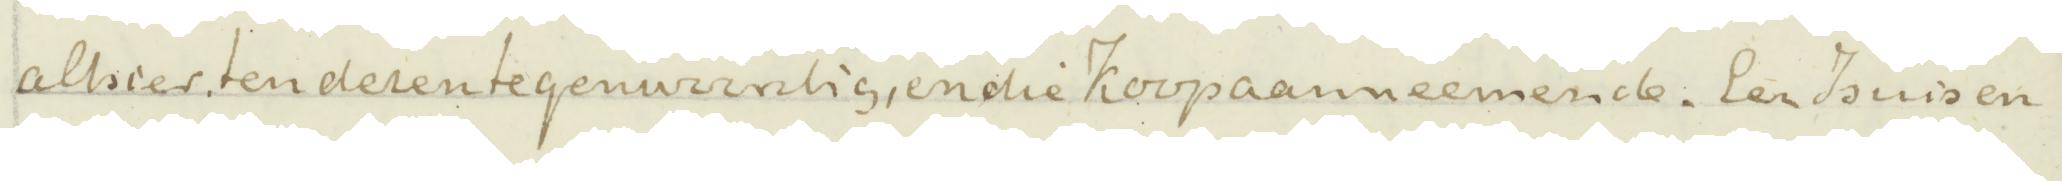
alhier, ten dezen tegenwoordig, en die koop aanneemende. Een huis en
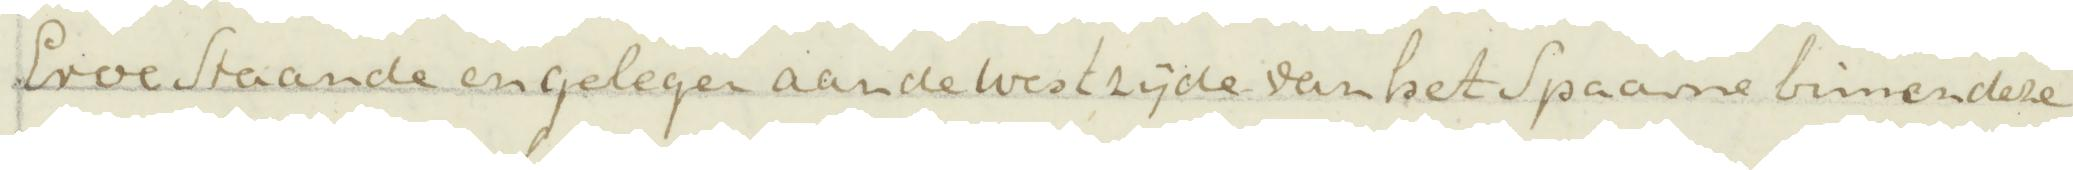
Erve staande en gelegen aan de westzijde van het Spaarne, binnen deze
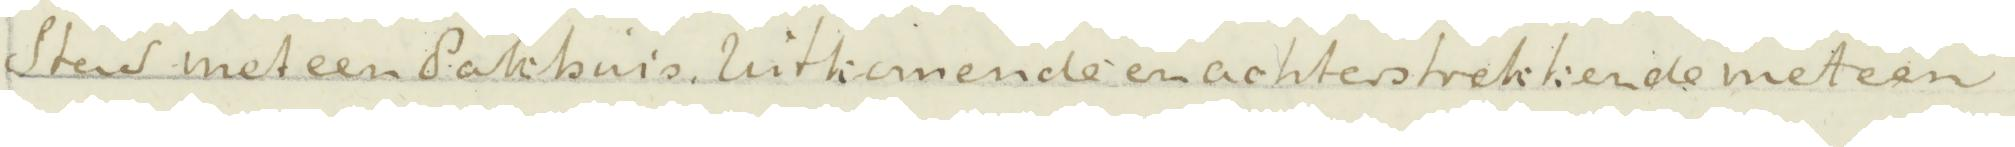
stad met een dakhuis, uitkomende en achterstrekkende met een
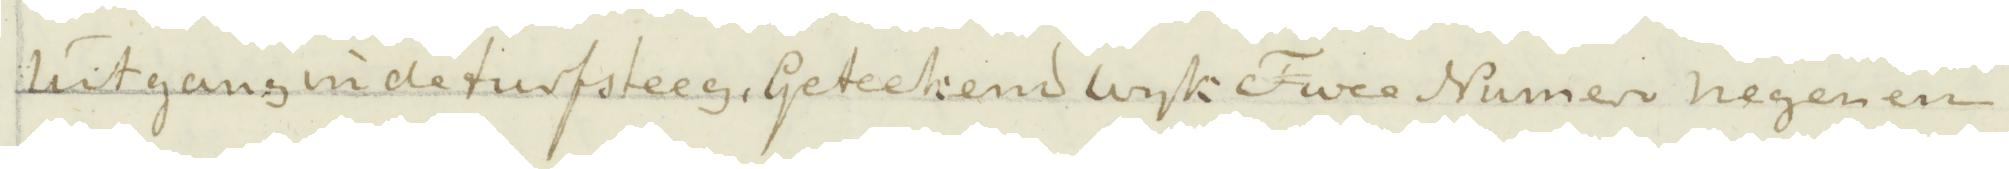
uitgang in de turfsteeg, Geteekend wijk Twee Numero negen en
